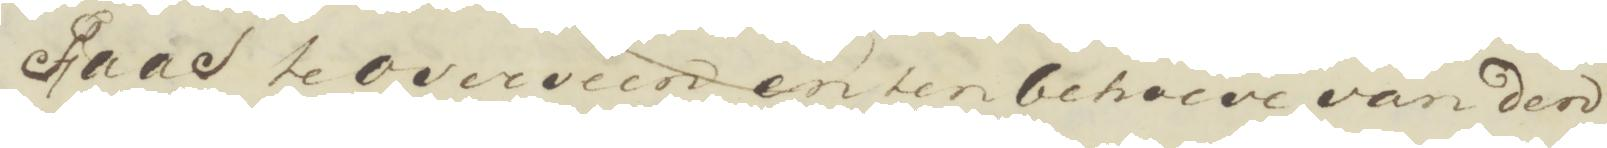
Haas te overveen en ten behoeve van den
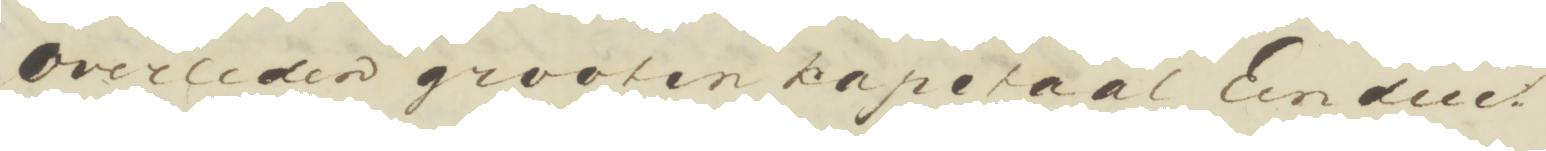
overleden groot in kapitaal Een dui„
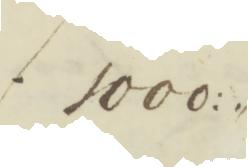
ƒ1000:„
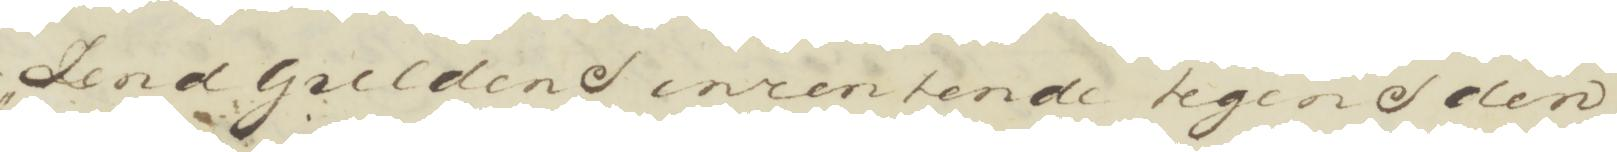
„zend guldens inrentende tegens den
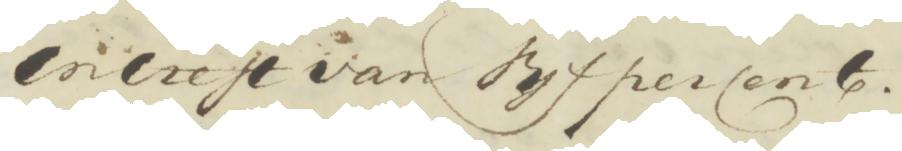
intrest van Vyf percent.
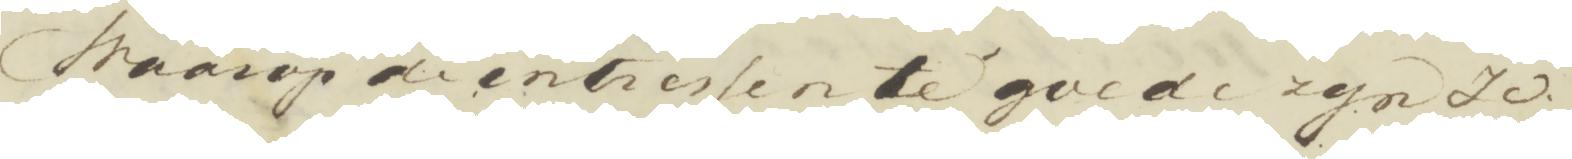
Waarop de intressen te goede zyn ze.
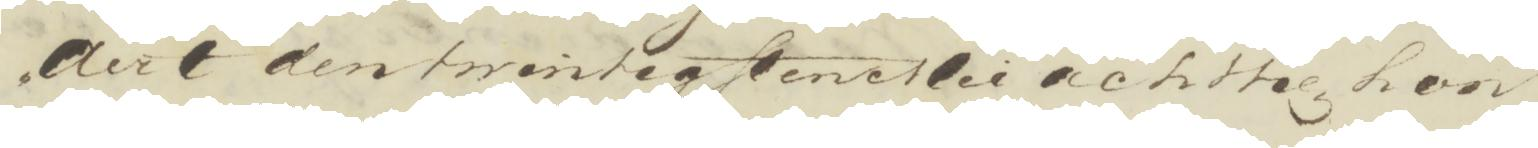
„dert den twintigsten achttien hon
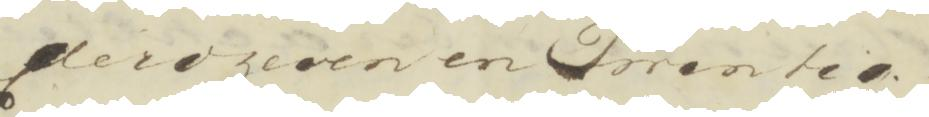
derdzeven en Twintig.
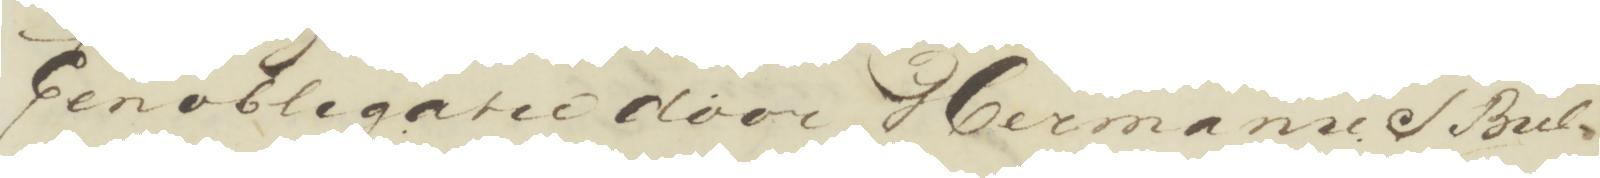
Een obligatie door Hermanus Bul„
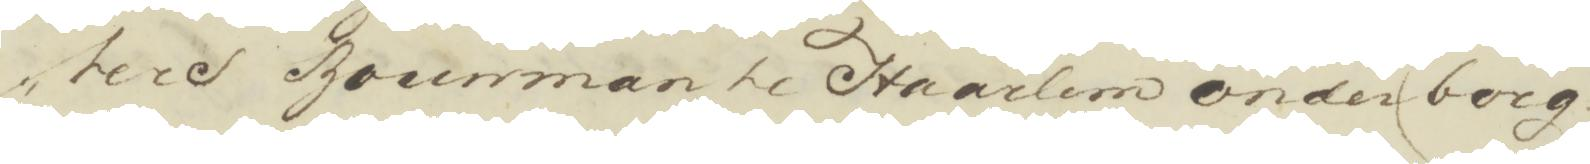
„ters Bouwman te Haarlem onder borg.
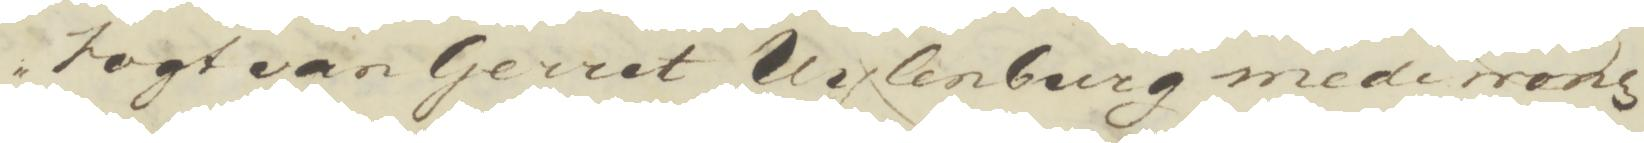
„togt van Gerrit Uylenburg mede wonen
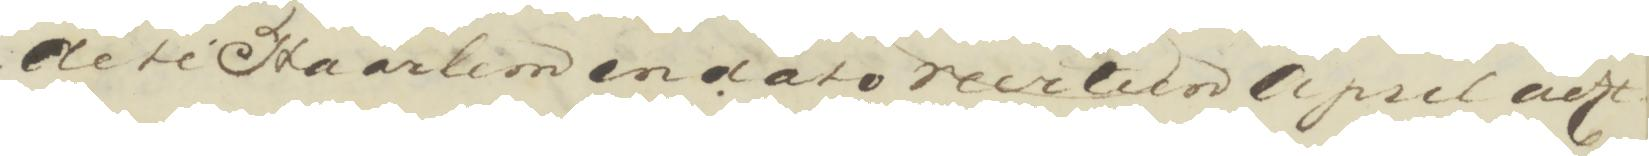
de te Haarlem in dato veertien April acht
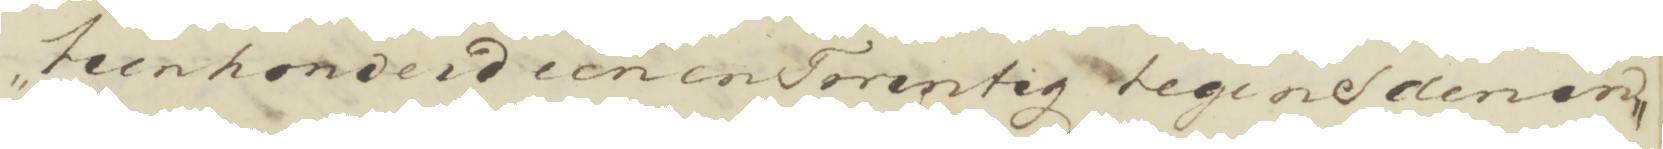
„tienhonderd een en Twintig tegens den in„
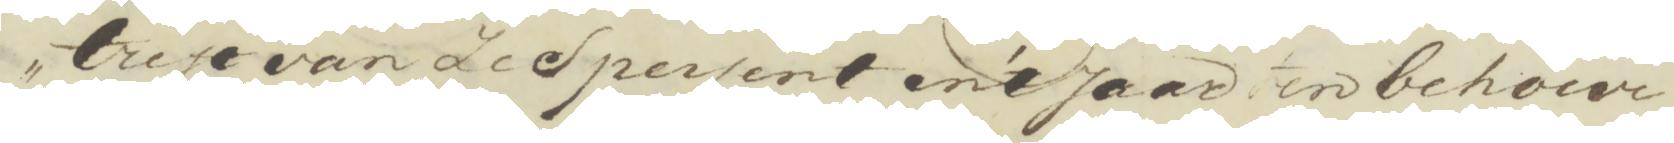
„trest van Zes percent in 't Jaar, en behoeve
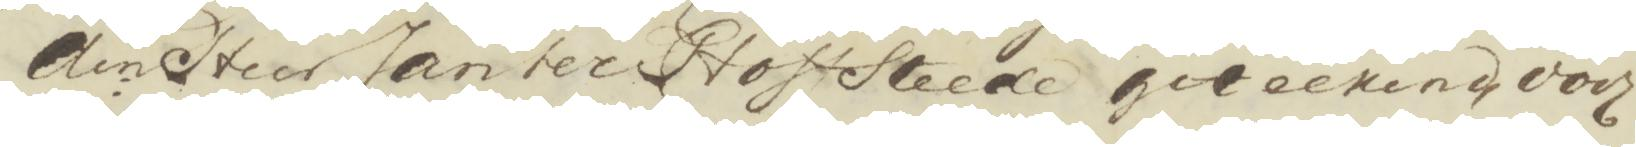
den Heer Jan ter Hoffsteede geteekend voor
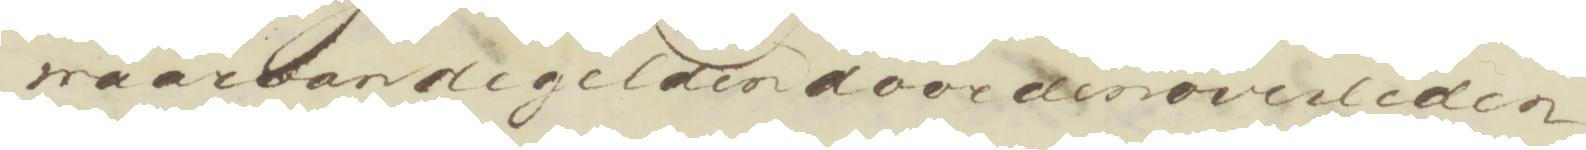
waarvan de gelden door den overleden
